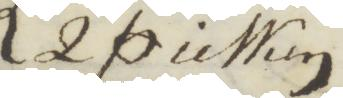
2 Piekken
